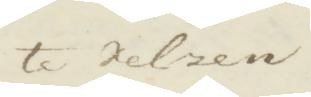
te velzen
